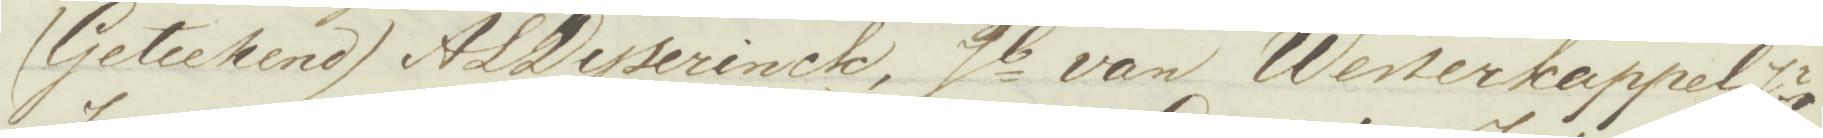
(Geteekend) ALDyserinck, J=b van Westerkappel J=r
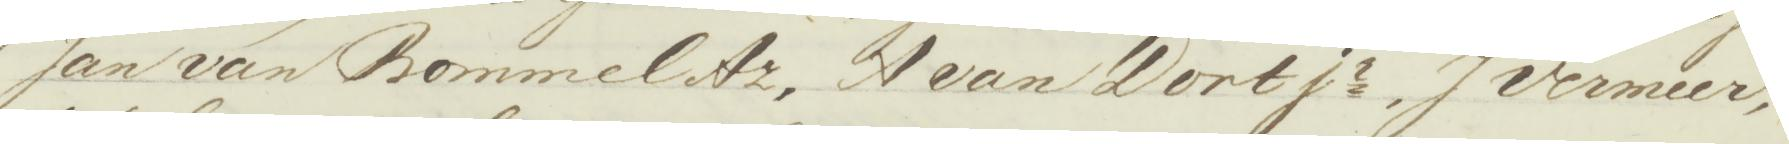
Jan van Bommel Az, A van Dort j=r, J Vermeer,
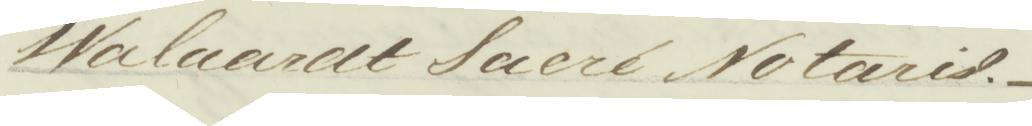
Walaardt Sacré Notaris.-
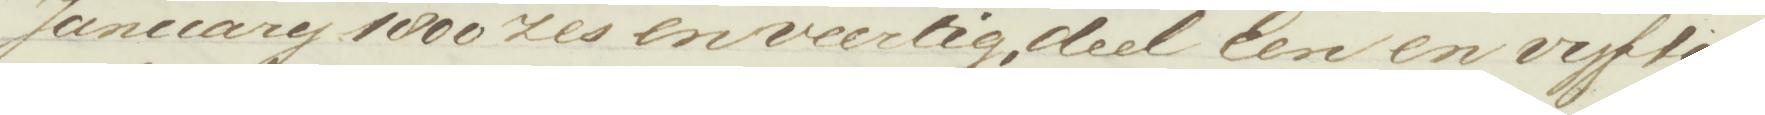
January 1800 zes en veertig, deel Een en vyftig,
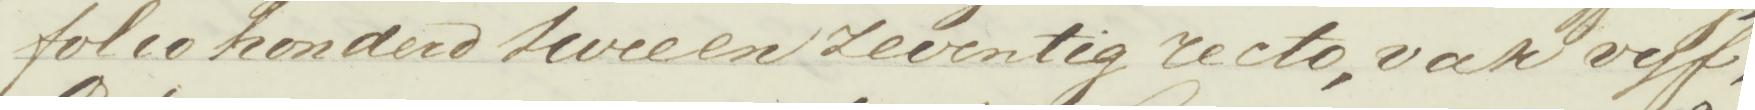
folio honderd twee en zeventig recto, vak vyf
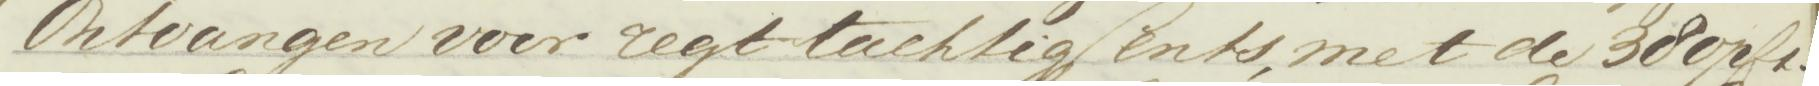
Ontvangen voor regt tachtig Cents, met de 38 opCt
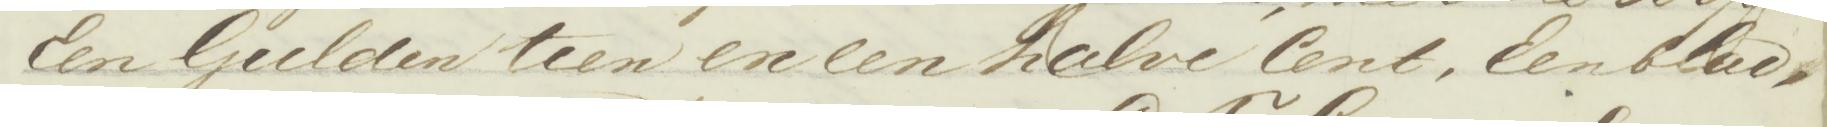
Een Gulden tien en een halve Cent, Een blad,
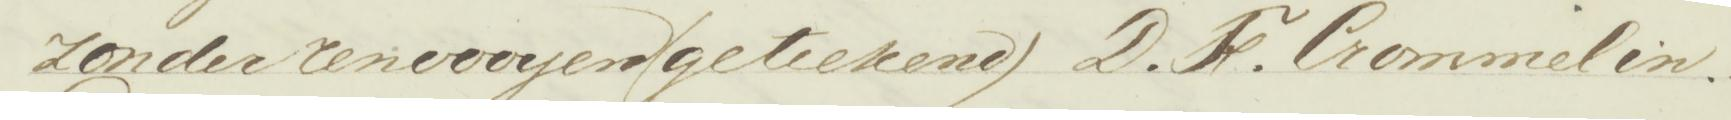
zonder renvooyen (geteekend) D. F. Crommelin.
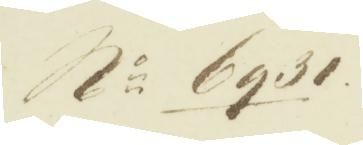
N=o 6931.
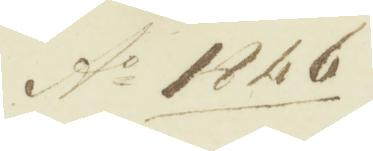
A=o 1846
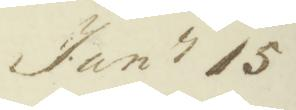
Iany 15
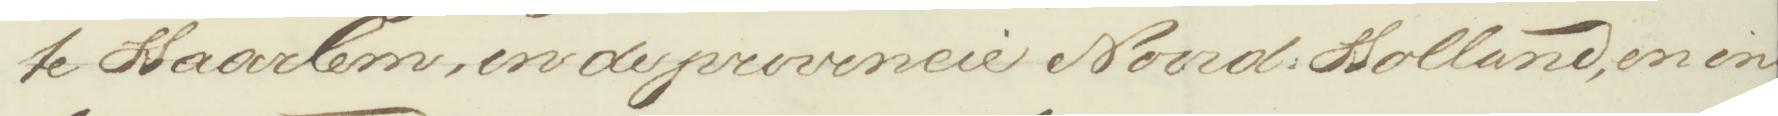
te Haarlem, in de provincie Noord: Holland, en in
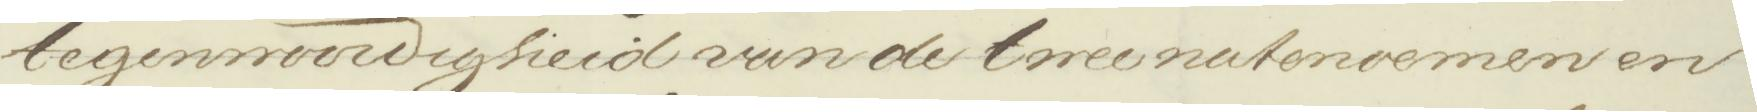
tegenwoordigheid van de twee natenoemen en
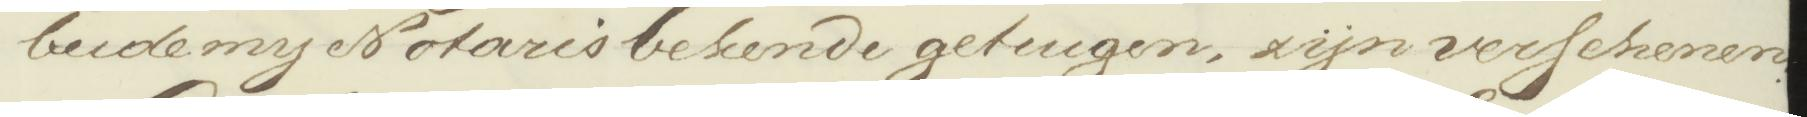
beide my Notaris bekende getuigen, zijn verschenen
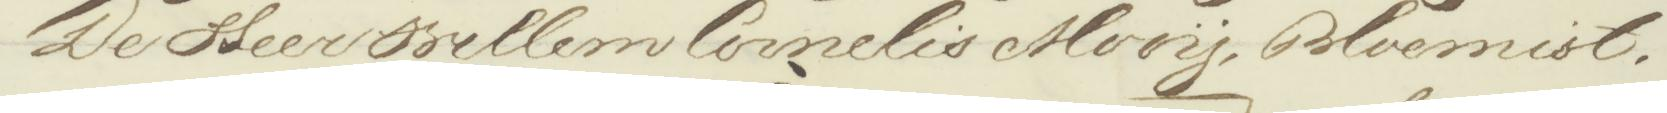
De Heer Willem Cornelis Mooij, Bloemist,
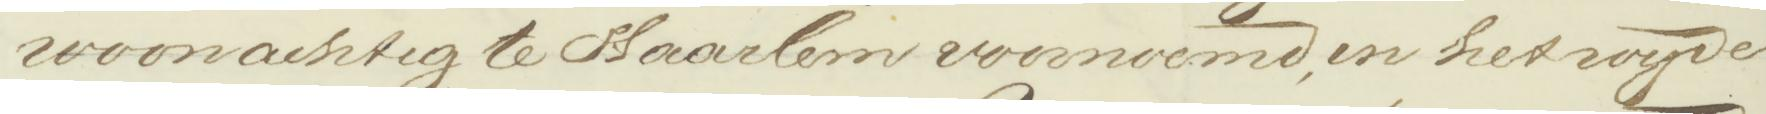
woonachtig te Haarlem voornoemd, in het wyde
